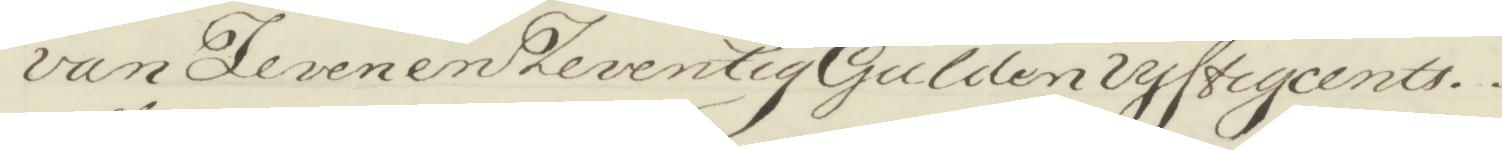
van Zeven en Zeventig Gulden vyftig cents.
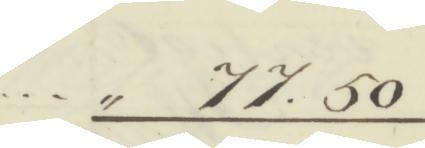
. . . „ 77.50
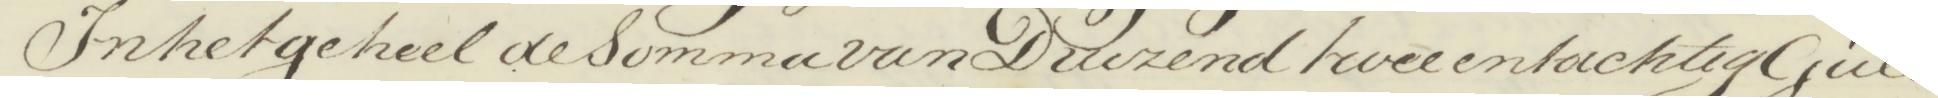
In het geheel de Somma van Duizend twee en tachtig Gul
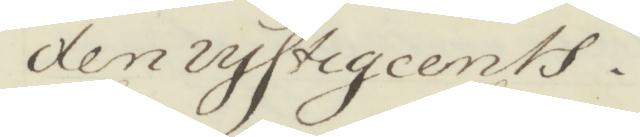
den vijftig cents.
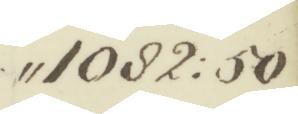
„1082:50
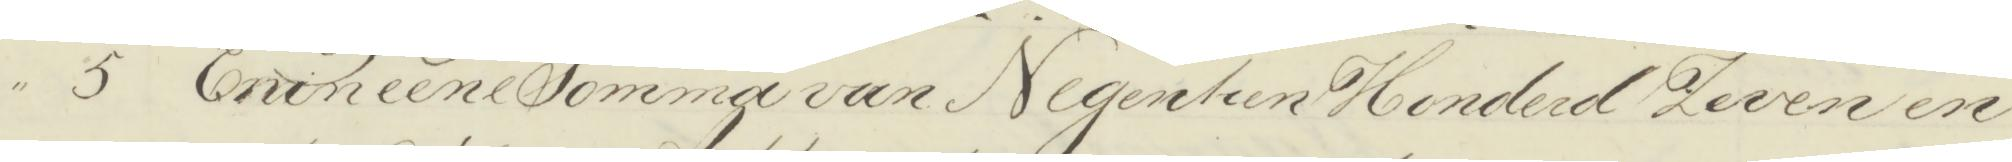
„ 5 En in eene Somma van Negentien Honderd Zeven en
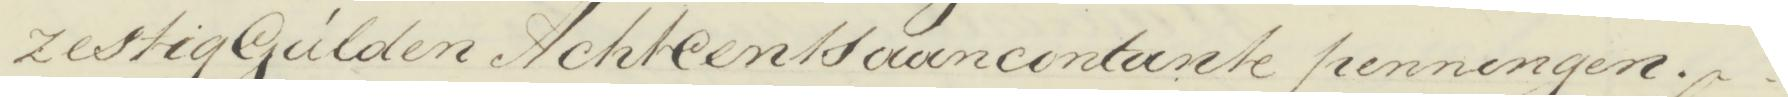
Zestig Gulden Acht cents aan contante penningen,
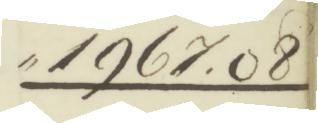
„ 1967.08
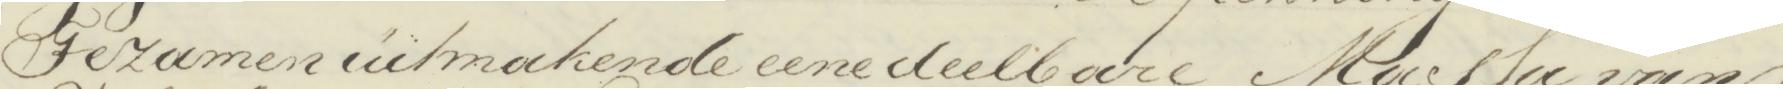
Tezamen uitmakende eene deelbare Massa van
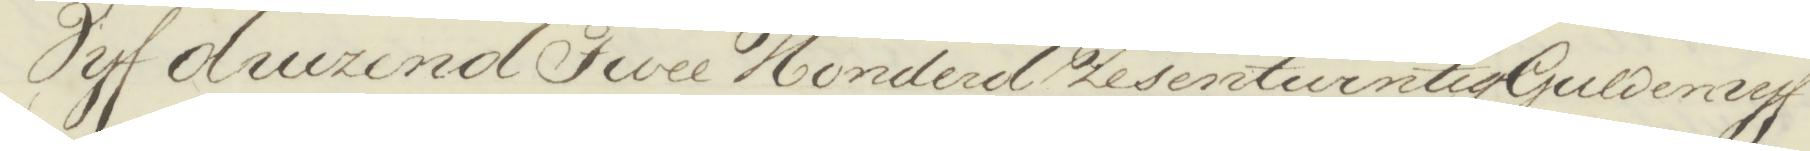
Vyf duizend Twee Honderd, Zesentwintig Gulden vyf
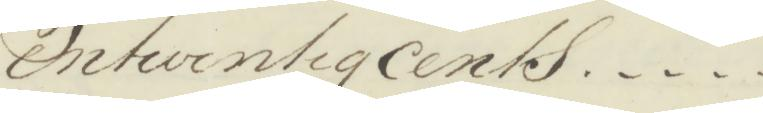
en twintig Cents . . . .
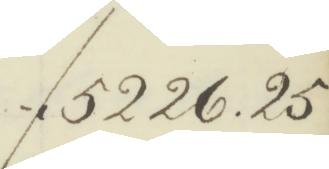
ƒ5226.25
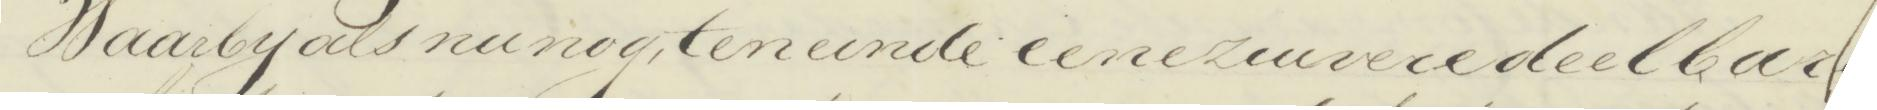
Waarby als nu nog, ten einde eene zuivere deelbare
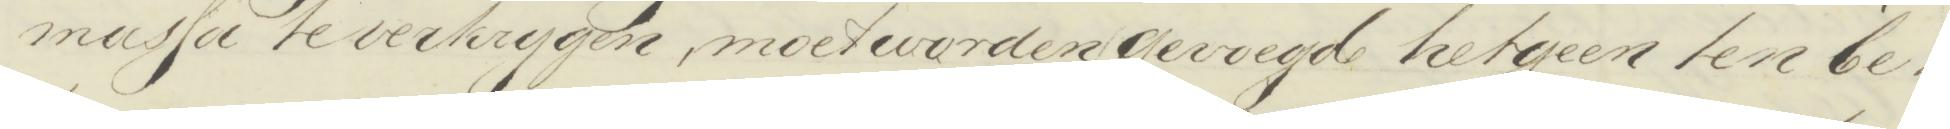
massa te verkrygen, moet worden gevoegd hetgeen ten be„
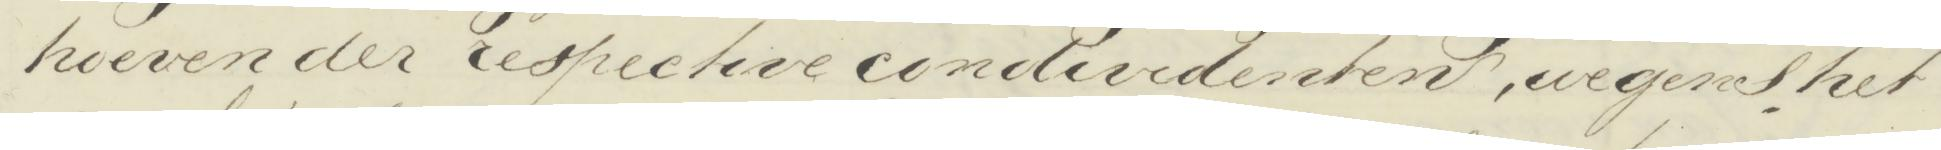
hoeven der respective condividenten wegens het
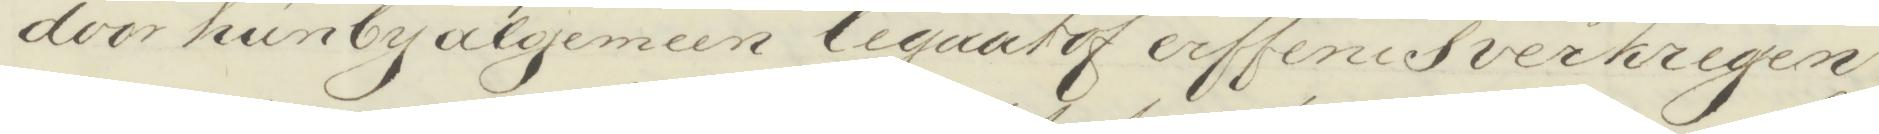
door hun by algemeen legaat of erffenis verkregen
